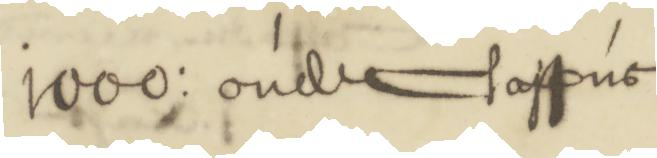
1000: oude clappus
